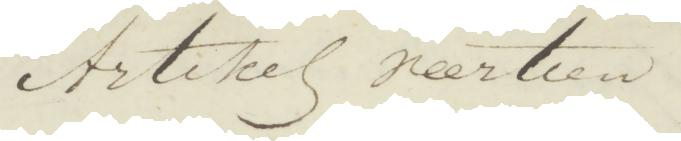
Artikel veertien
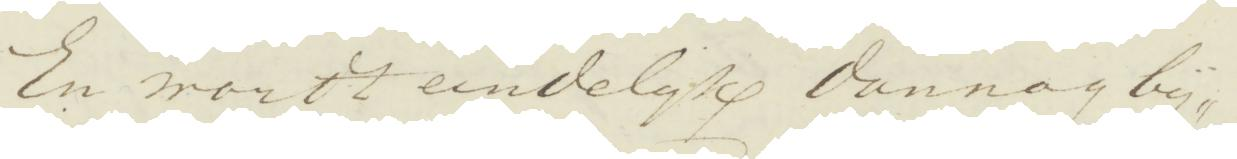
En wordt eindelijk dan nog bij„
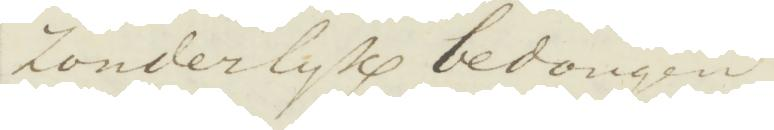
zonderlyk bedongen
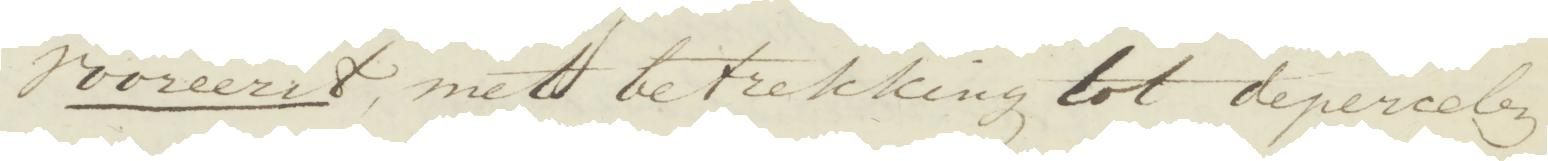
vooreerst met betrekking tot de percelen
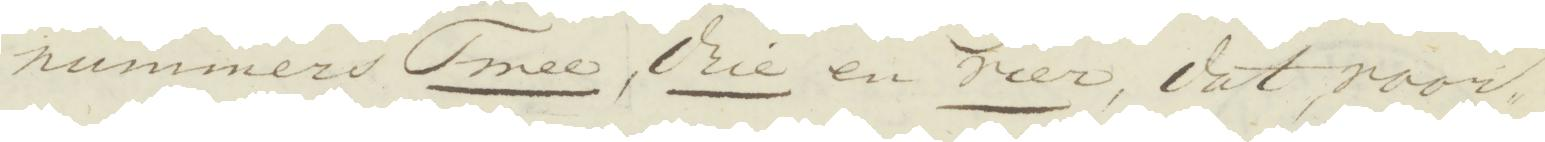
nummers Twee, drie en vier, dat, voor„
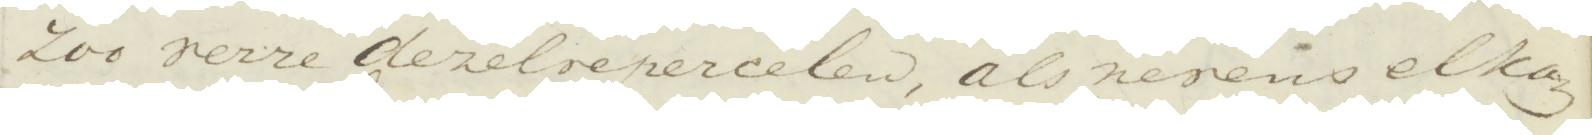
zoo verre dezelve percelen, als nevens elkan
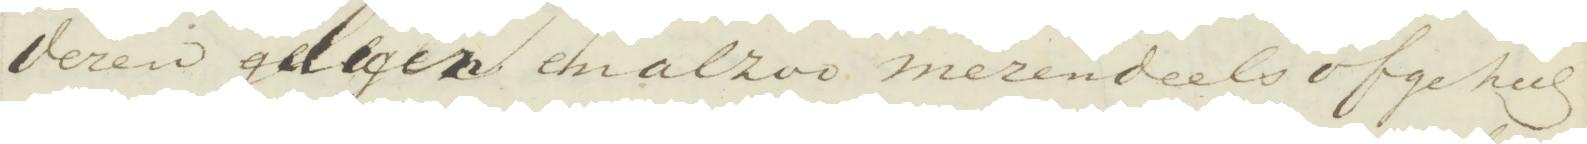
deren gelegen en alzoo merendeels of geheel
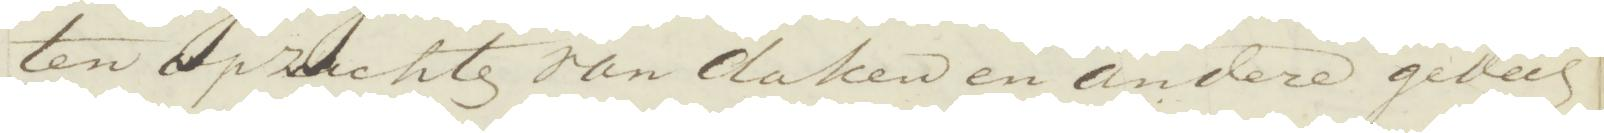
ten opzichten van daken en andere gedeel
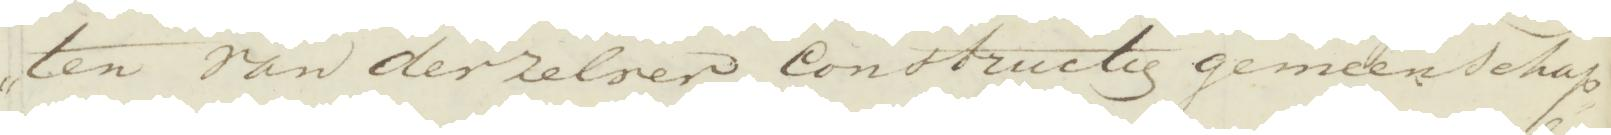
ten van derzelver constructie gemeenschap„
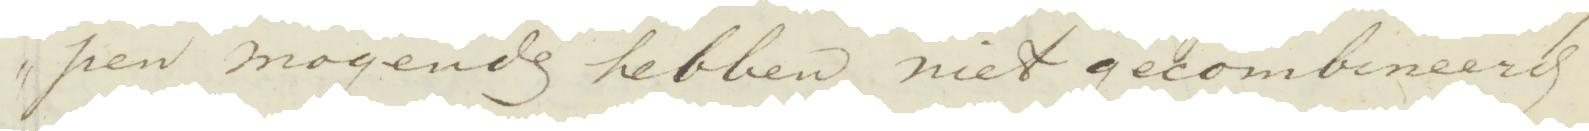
„pen mogende hebben, niet gecombineerd
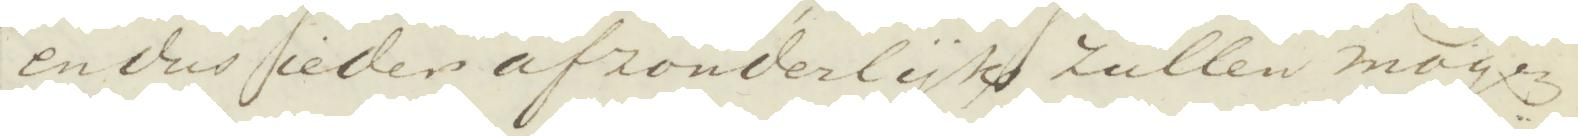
en dus ieder afzonderlijk zullen mogen
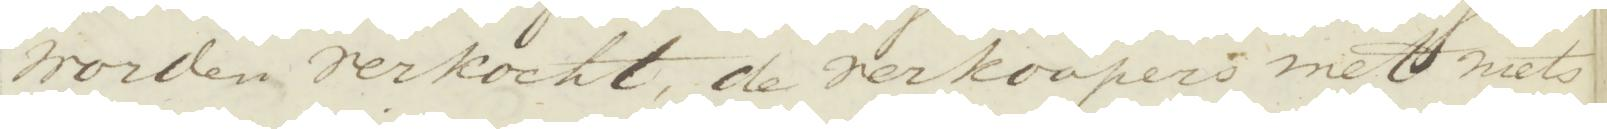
worden verkocht, de verkoopers met niets
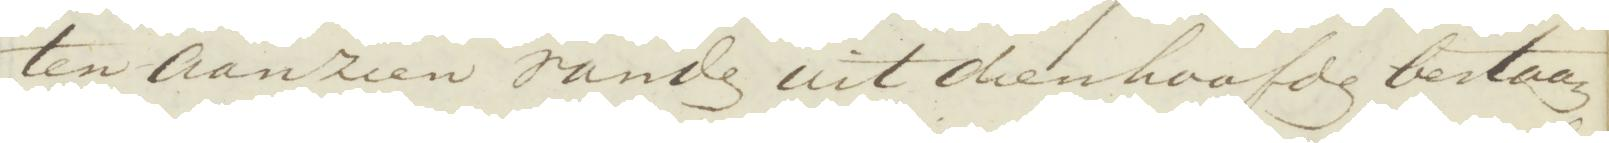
ten aanzien van de uit dien hoofde bestaan
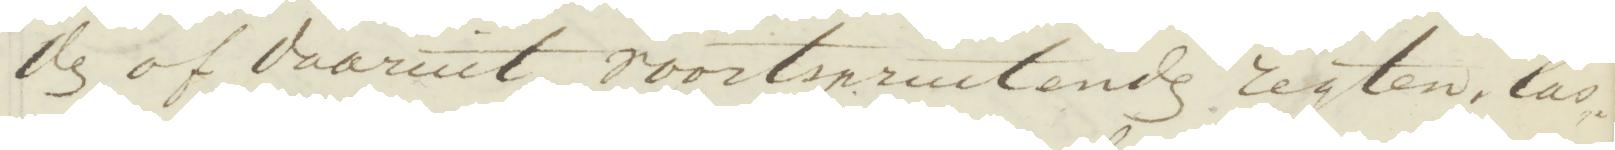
de of daaruit voortspruitende regten, las„
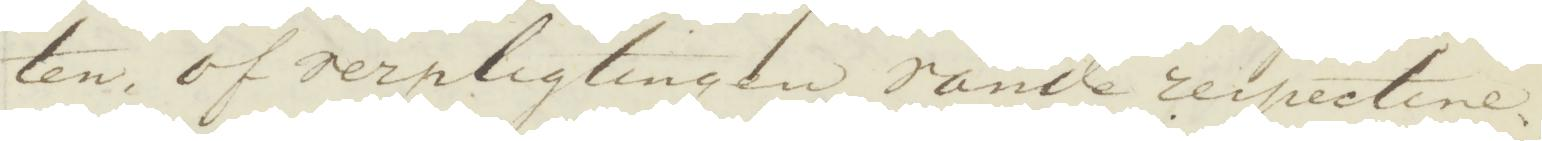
ten, of verpligtingen van de respective
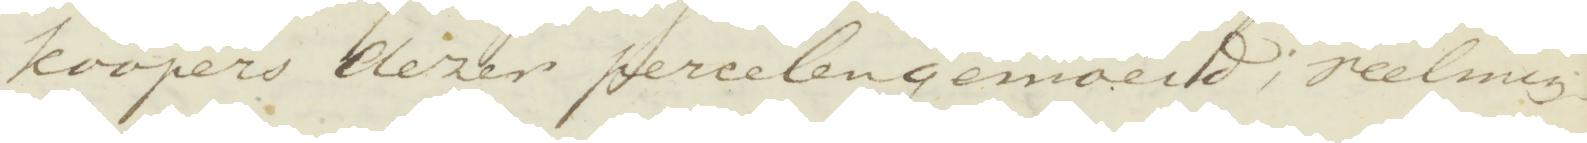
koopers dezer percelen gemoeid; veel min
